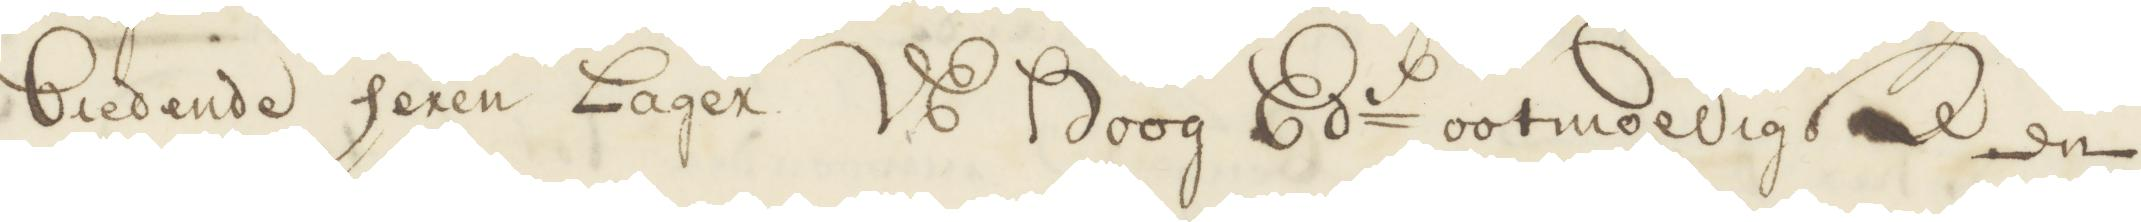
biedende heren Lager VE Hoog Ed=s ootmoedigste en
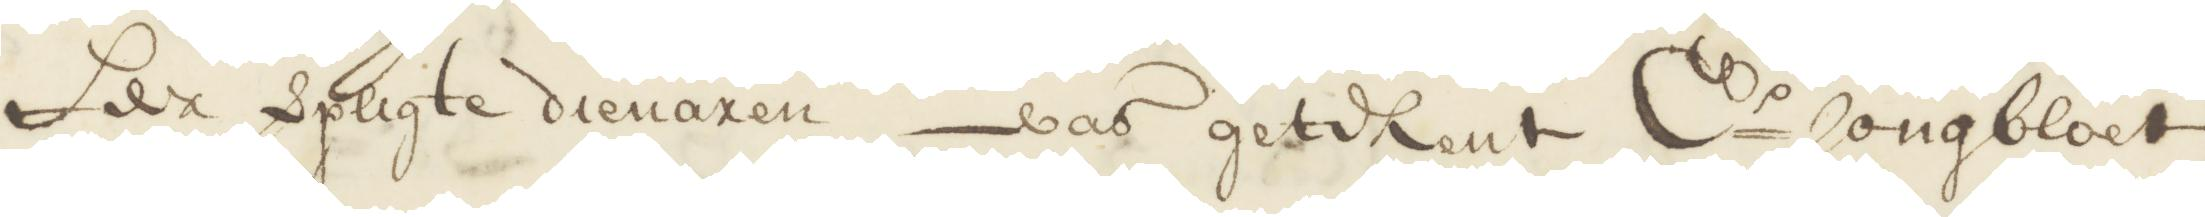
seer verpligte dienaren was getekent C=s Jongbloet
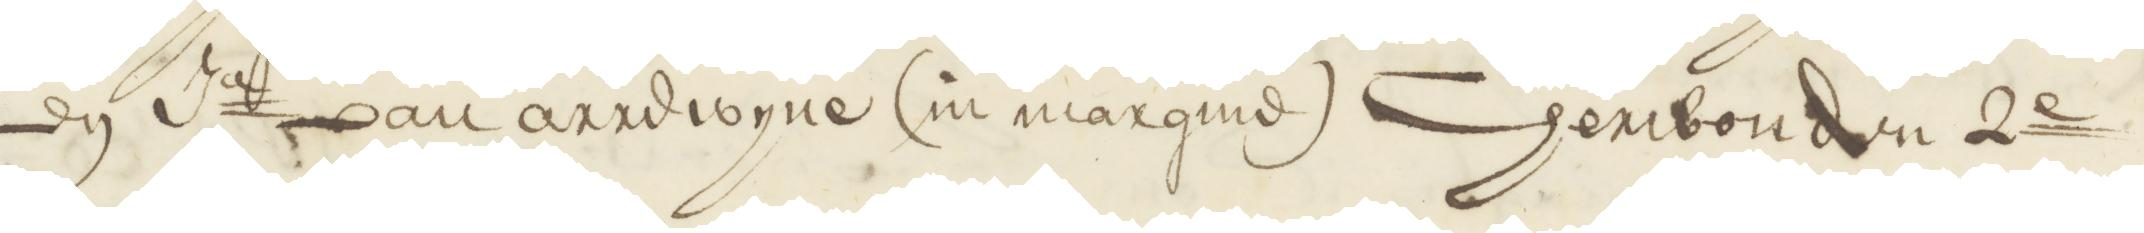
en J=a van arrewijne (in margine) Cheribon den 2=e
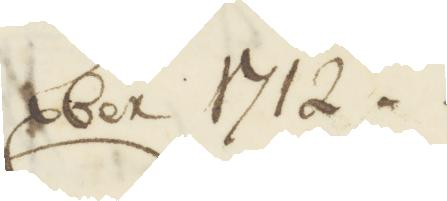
xber 1712.
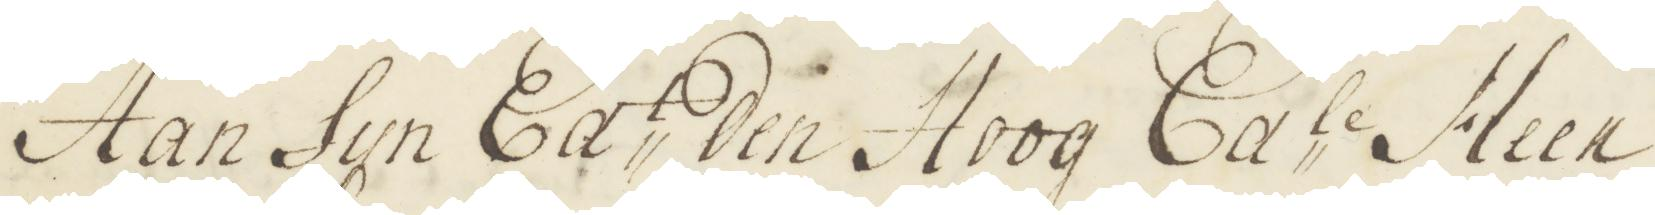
Aan sijn Ed„t den Hoog Ed„le Heer
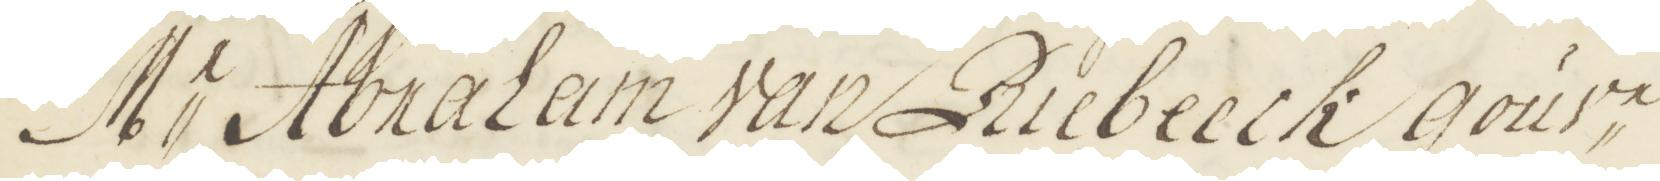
M„r Abraham van Riebeeck gouv„r
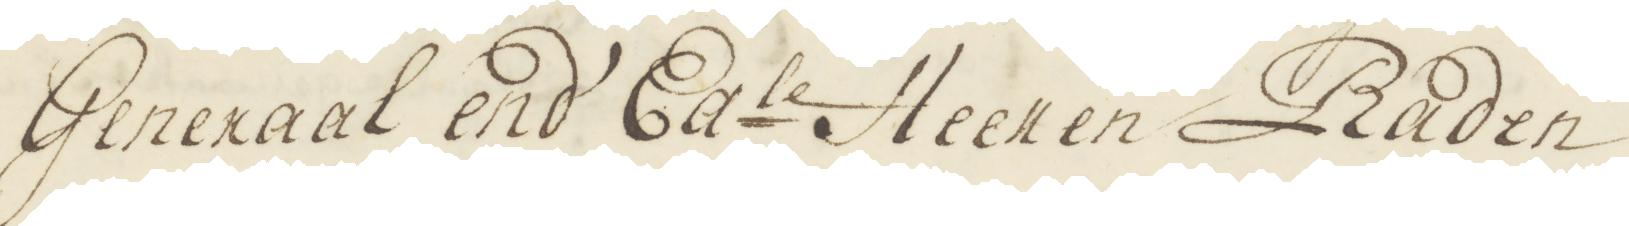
Generaal end’ Ed=le Heeren Raden
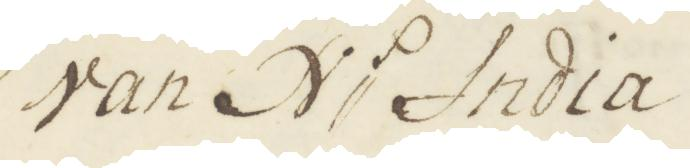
van N„s India
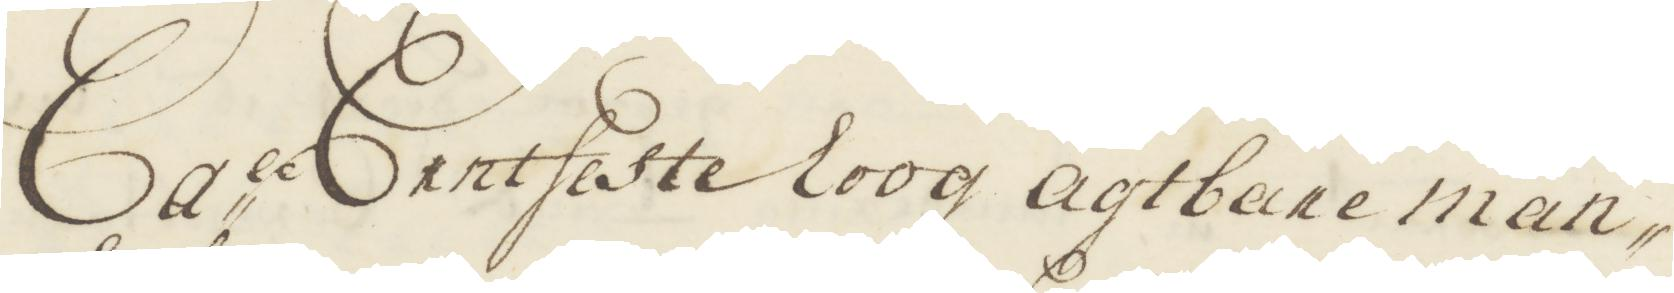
Ed„le Erntfeste hoog agtbare man„
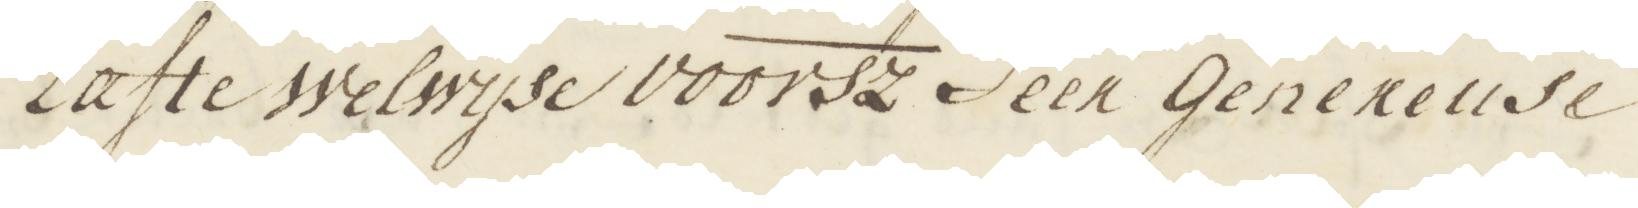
hafte welwijse voorsz seer genereuse
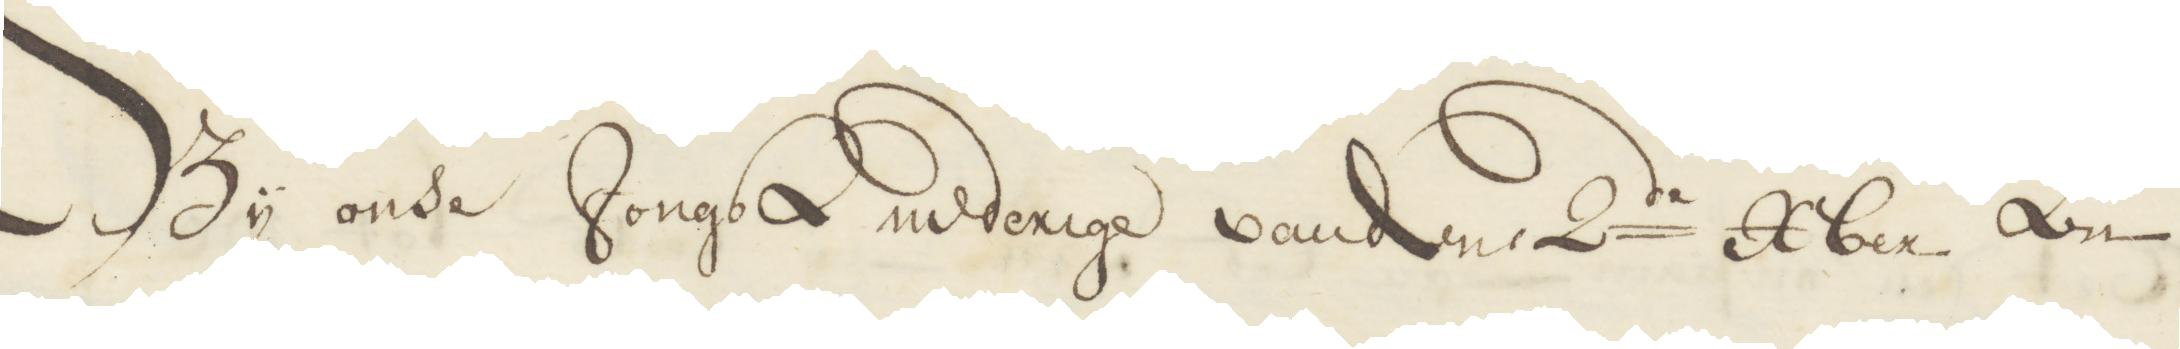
Bij onse jongst nederige vanden 2=de Xber ten
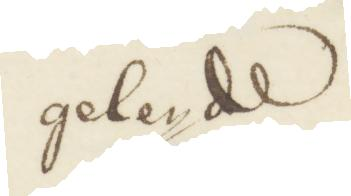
geleyde
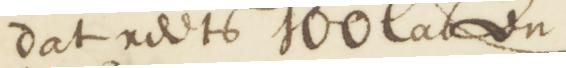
dat reets 100 lasten
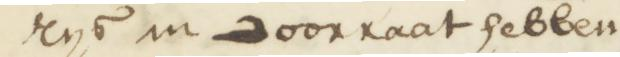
rijs in voorraat hebben
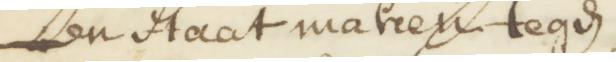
en staat maken tegen
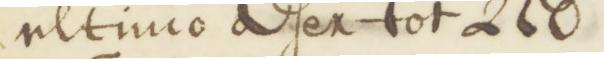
ultimo deser tot 250
